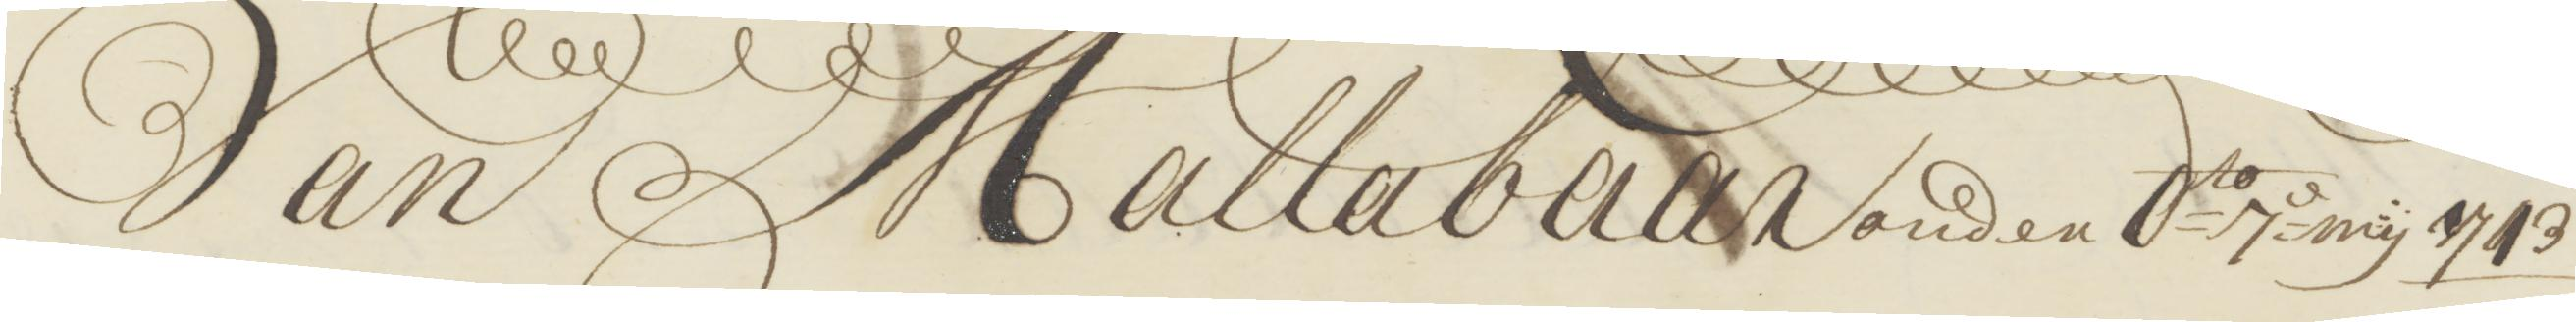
Van Mallabaar onder d=to 7:e meij 1743
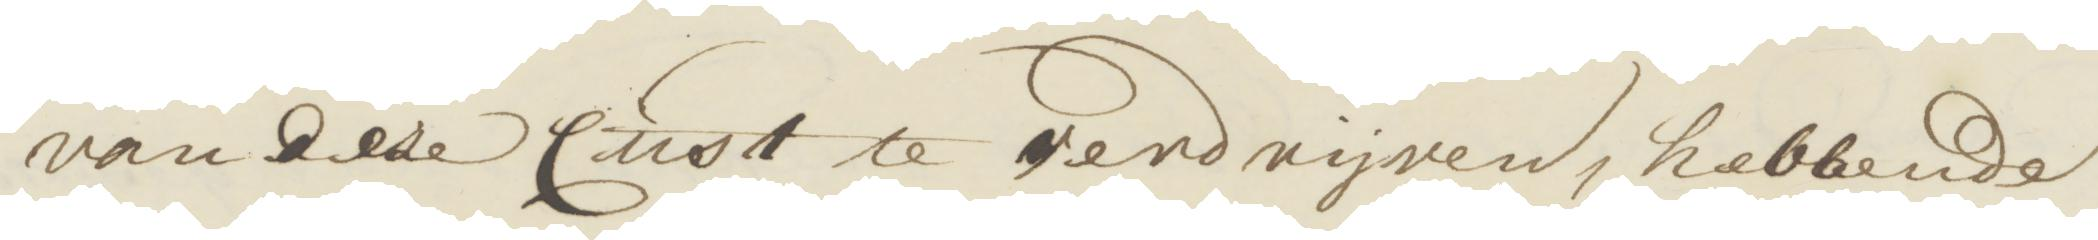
van deze Cust te verdrijven, hebbende
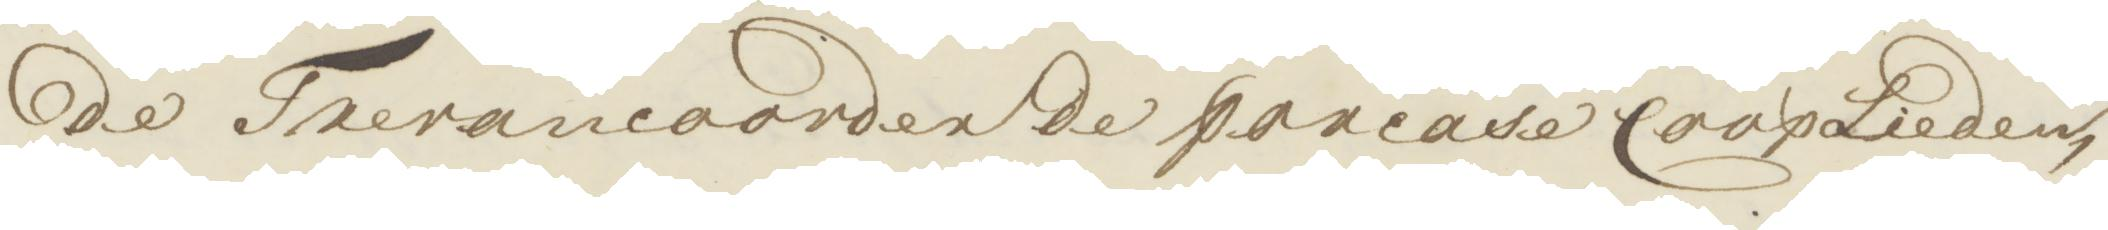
de Trevancoorder de parcase Cooplieden,
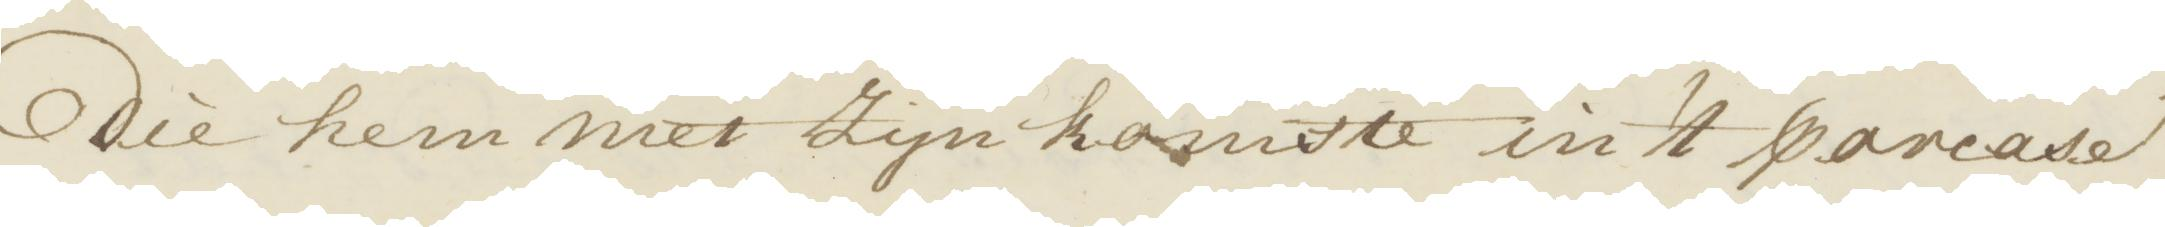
die hem met zijn komste in ’t parcase
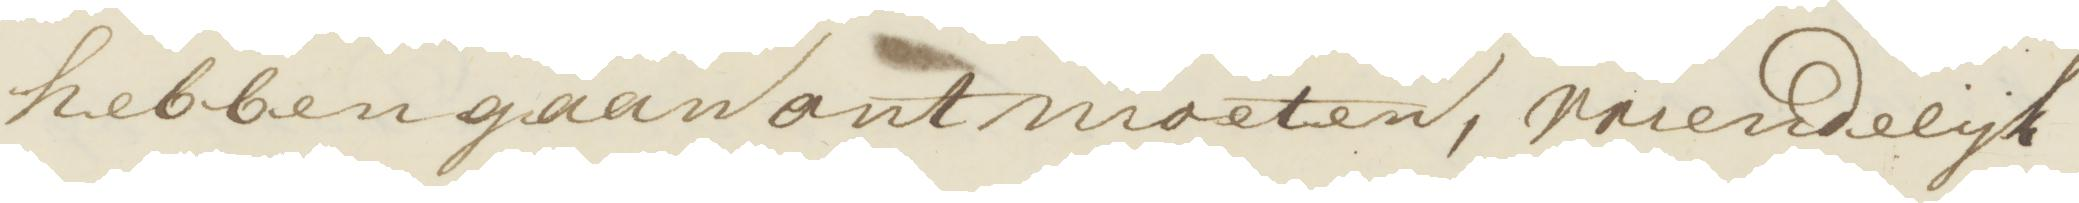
hebben gaan ontmoeten, vriendelijk
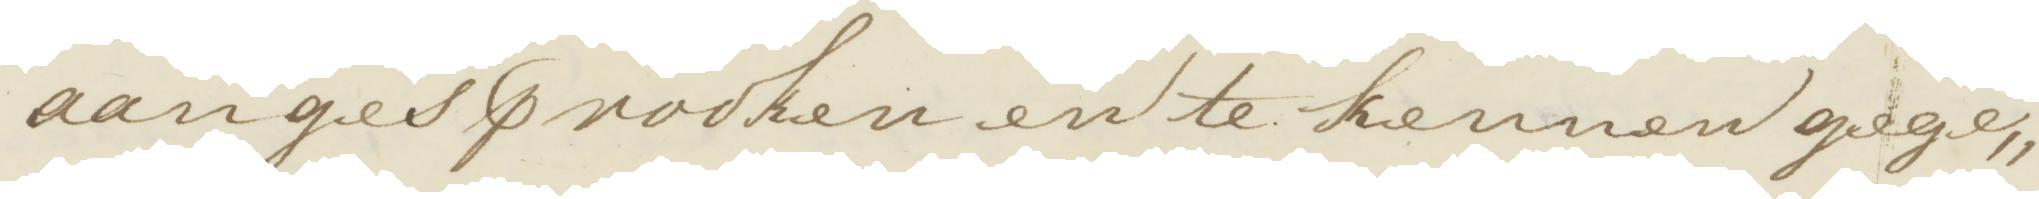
aangesprooken en te kennen gege„
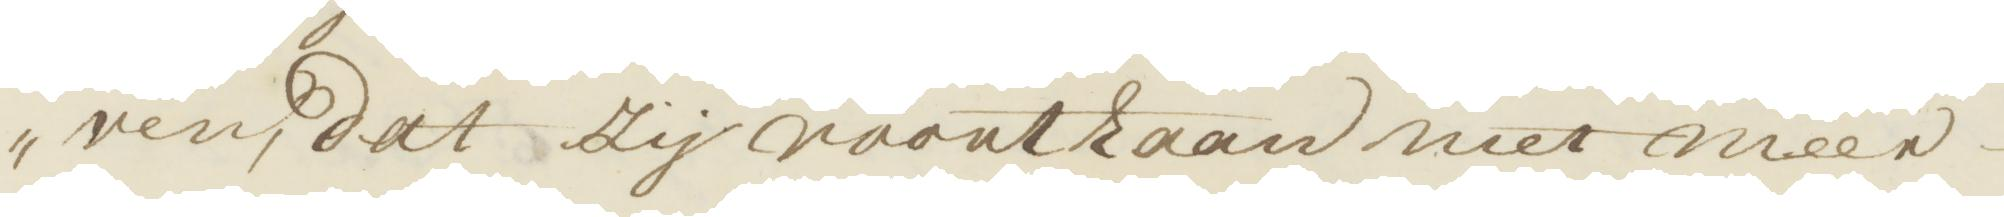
„ven, dat zij voorthaan niet meer
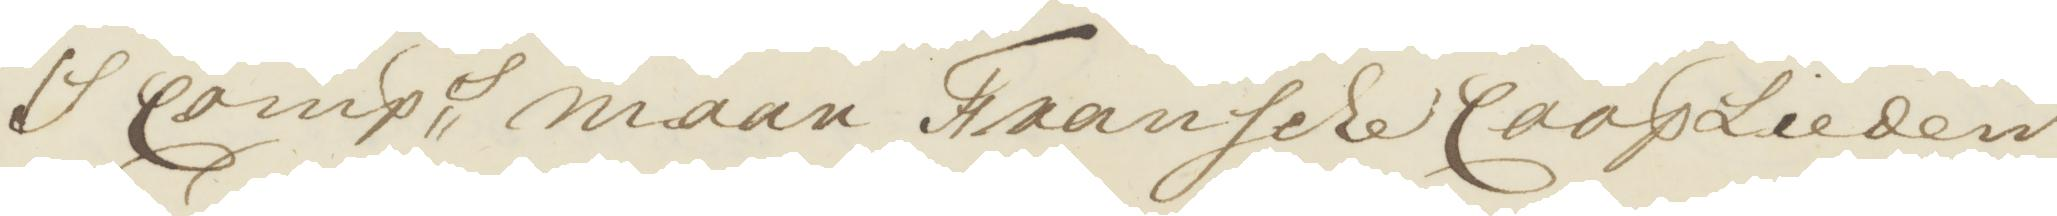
’s Comp„s maar Fransche Cooplieden
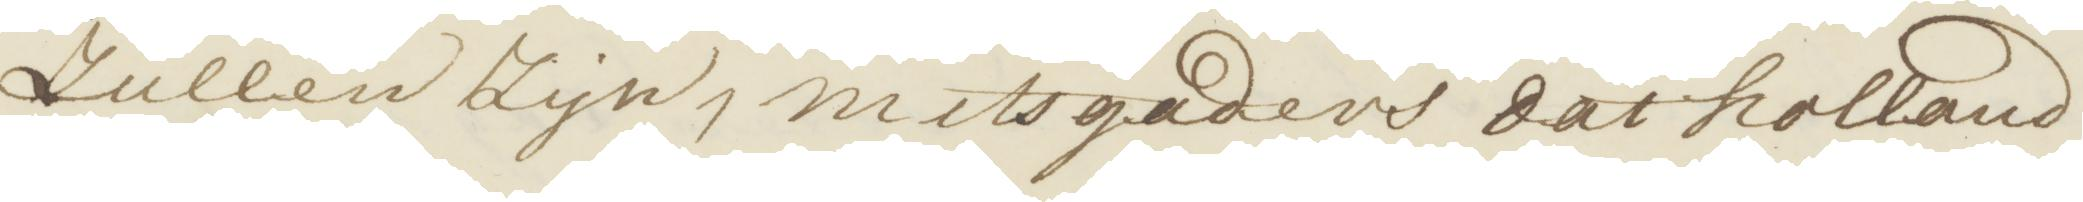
zullen zijn, mitsgaders dat holland
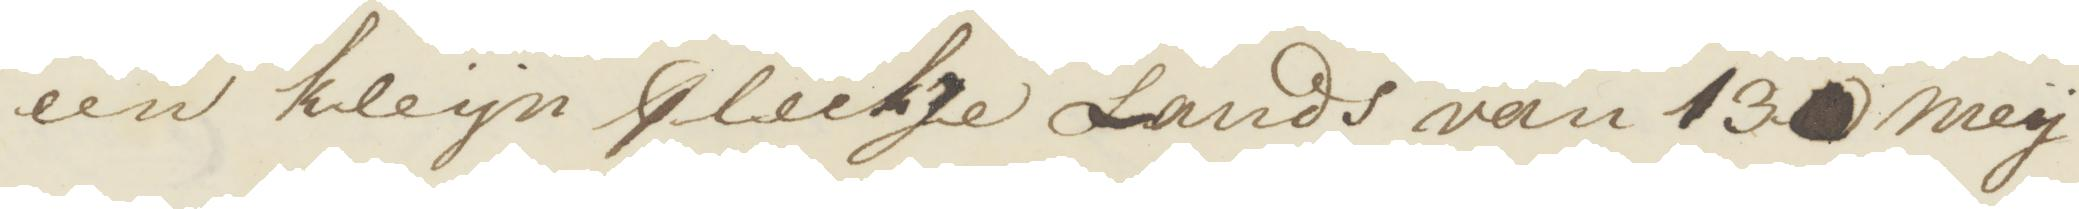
een kleijn pleckje Lands van 130 meij
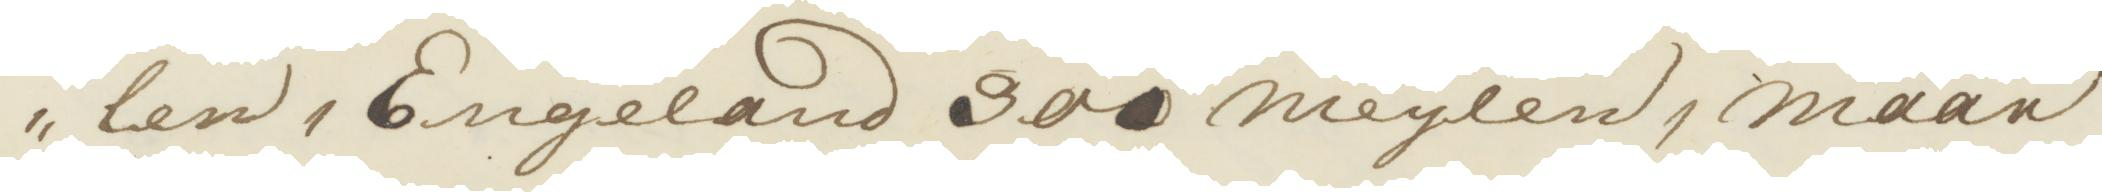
„len, Engeland 300 meijlen, maar
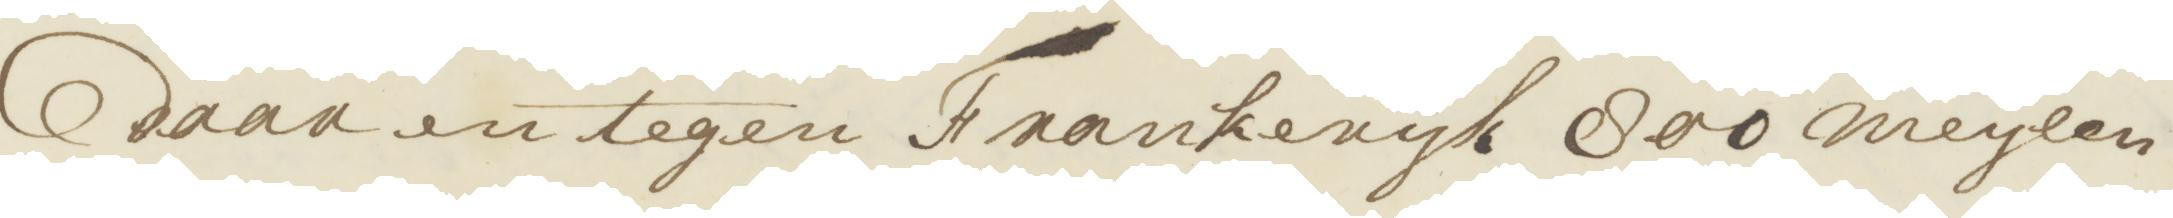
daar en tegen Frankerijk 800 meijlen
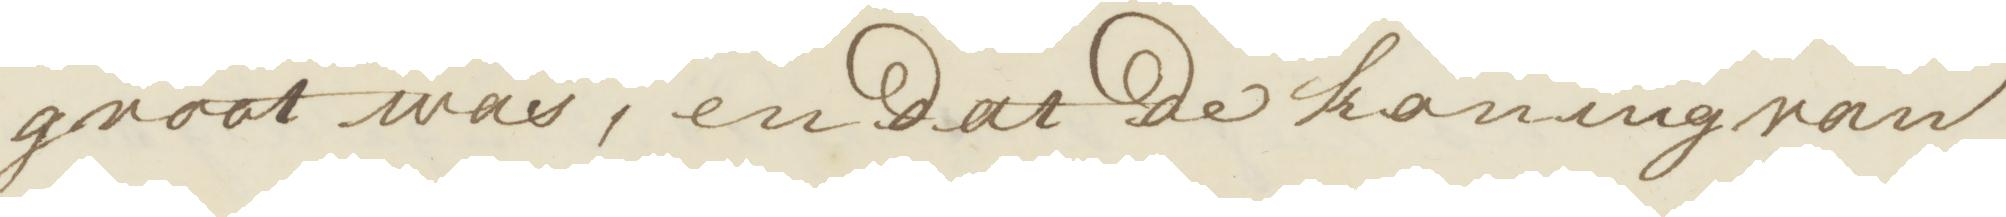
groot was, en dat de koning van
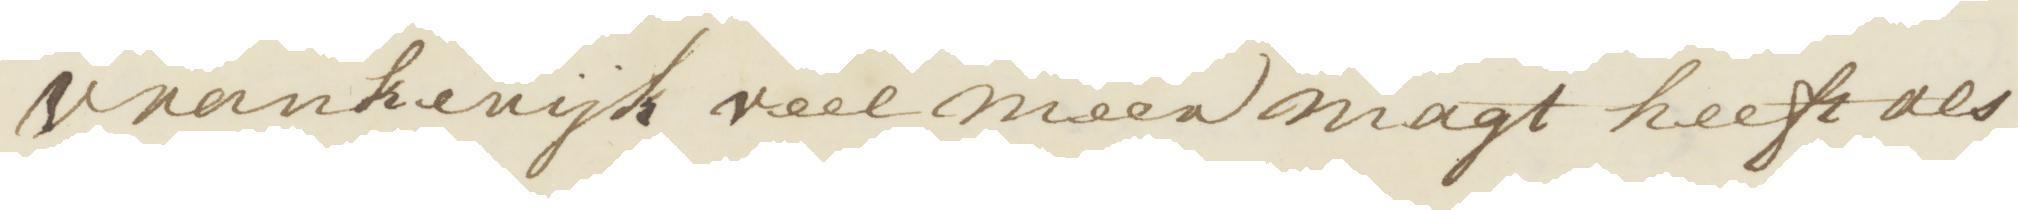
vrankerijk veel meer magt heeft als
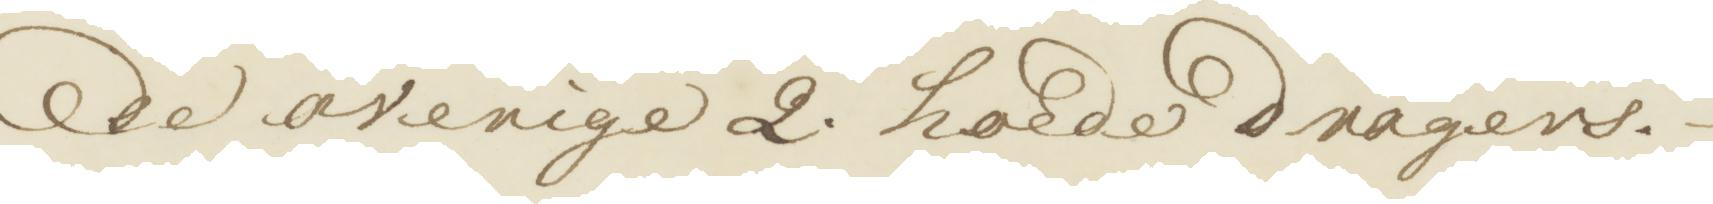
de overige 2: hoede dragers.
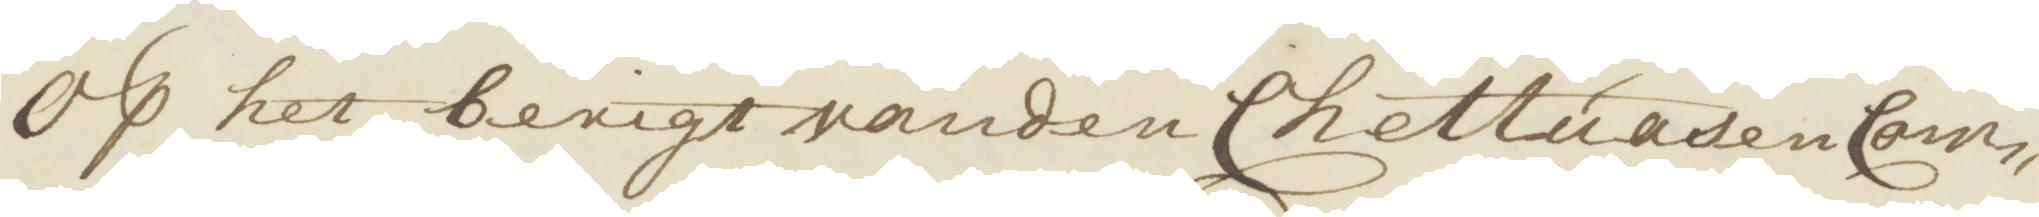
Op het berigt vanden Chettuasen Com„
